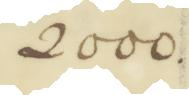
2000.
